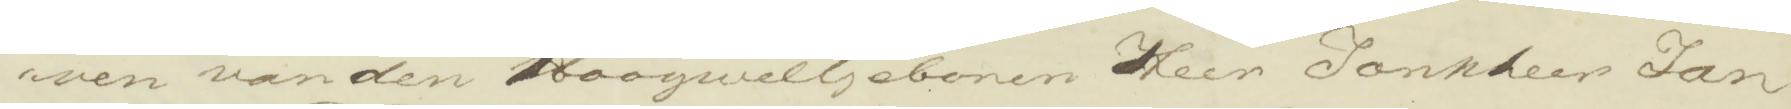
ven van den HoogwelGeboren Heer Ionkheer Ian
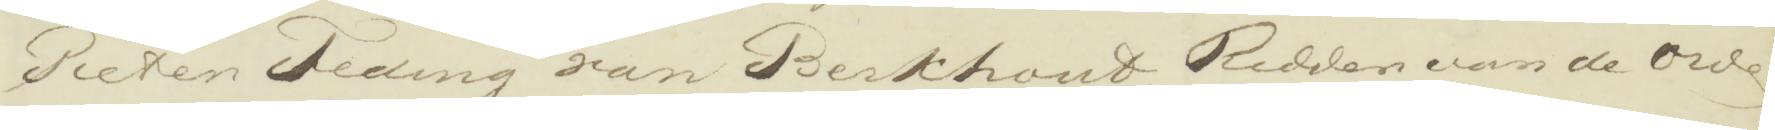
Pieter Teding van Berkhout, Ridder van de Orde
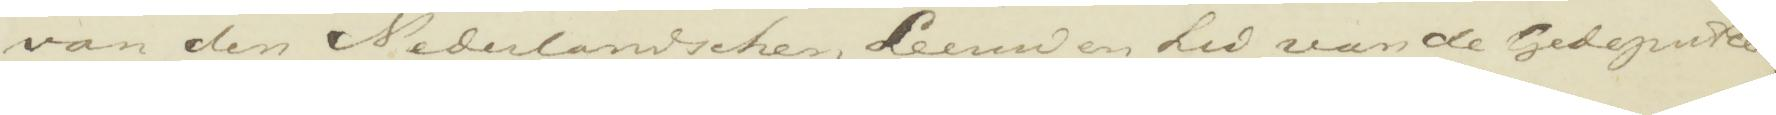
van den Nederlandschen Leeuw en Lid van de Gedeputeer
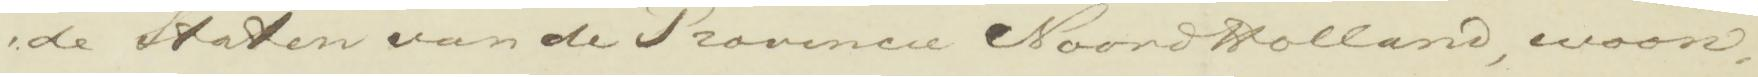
„de staten van de Provincie Noord Holland, woon
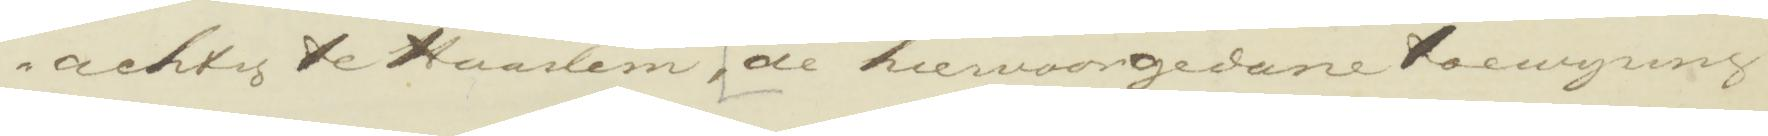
„achtig te Haarlem, [de hiervoorgedane toewyzing
